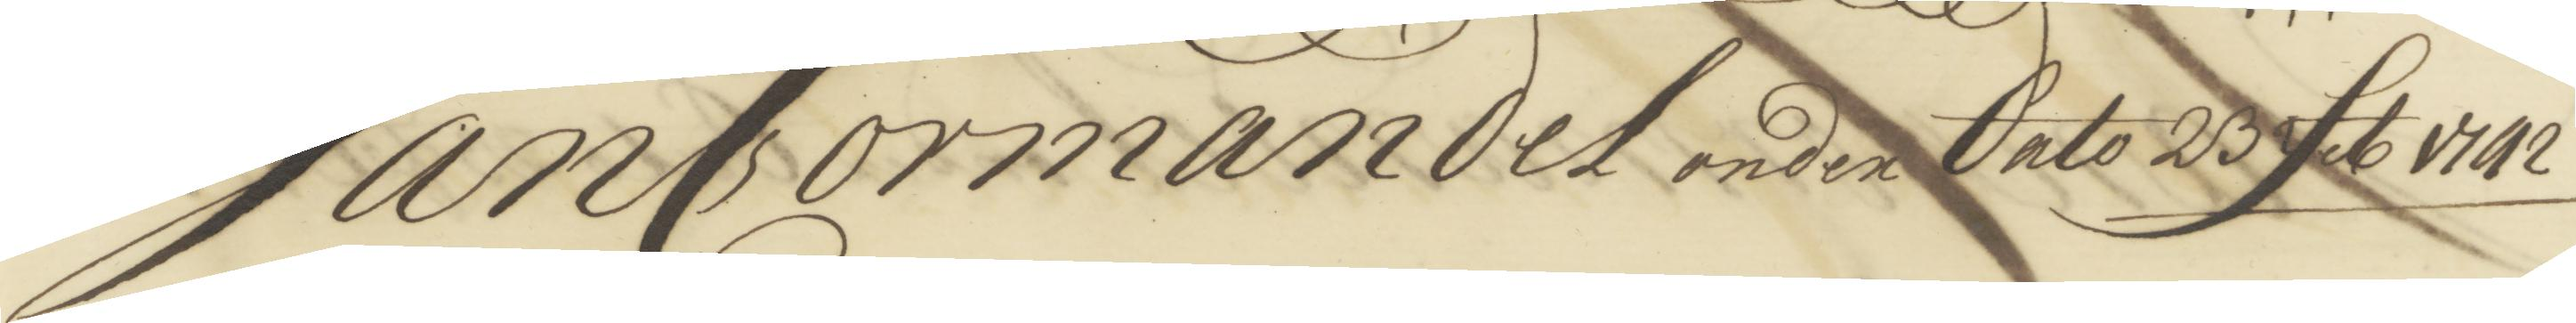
Van Cormandel onder dato 23 feb 1742
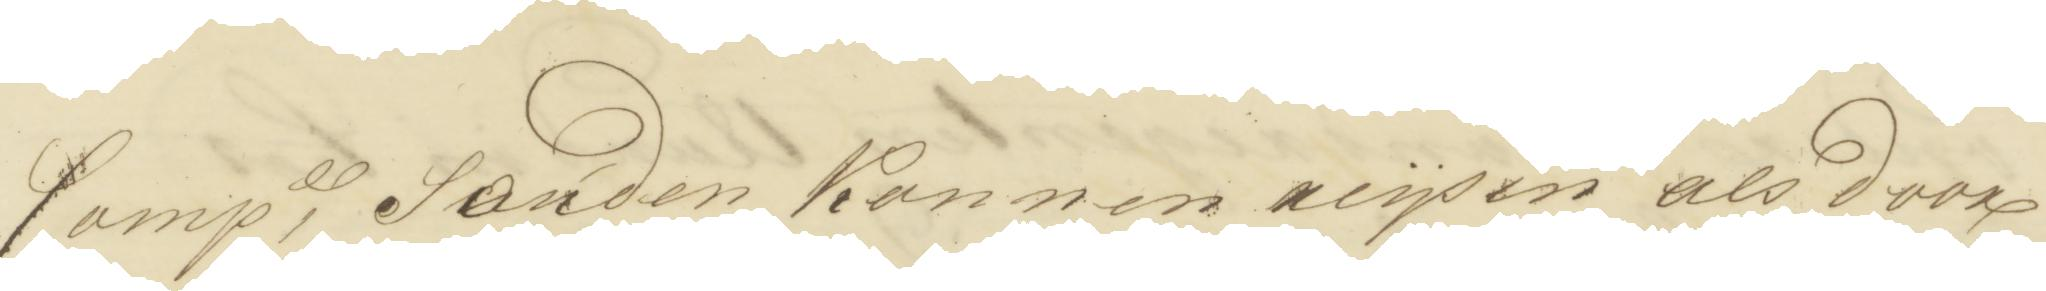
Comp„e souden konnen reijsen als door
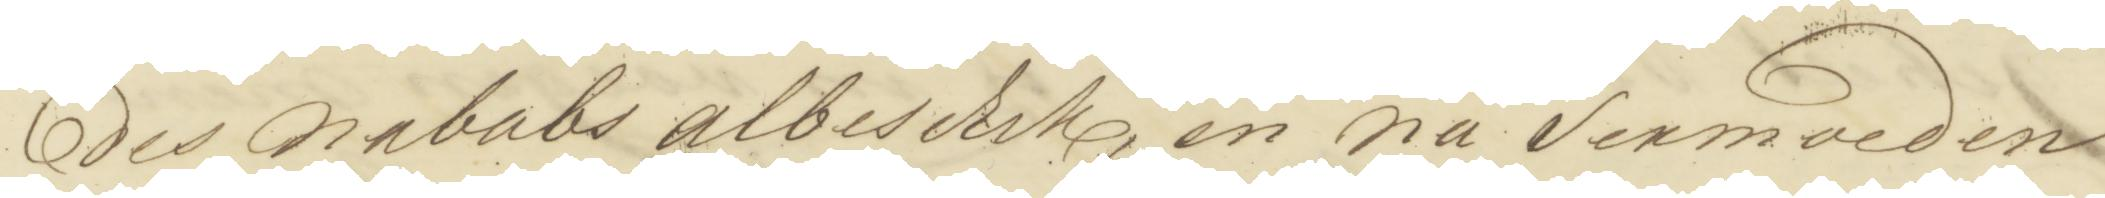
des nababs albeschik, en na vermoeden
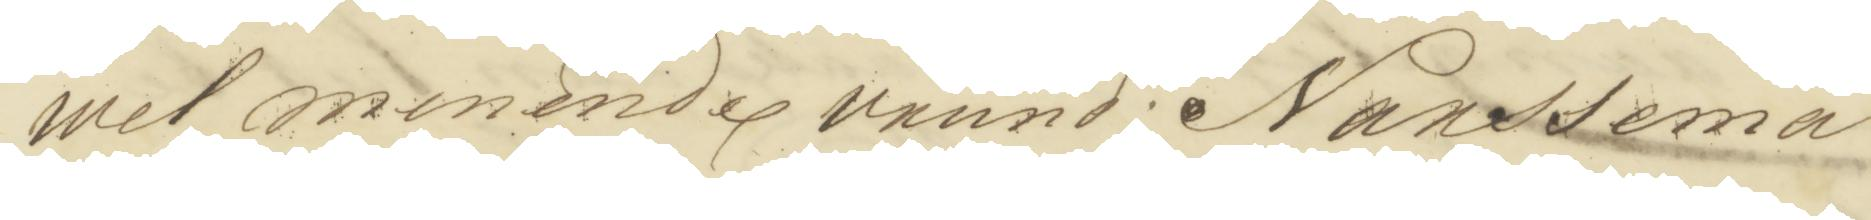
wel menende vrund Narssema
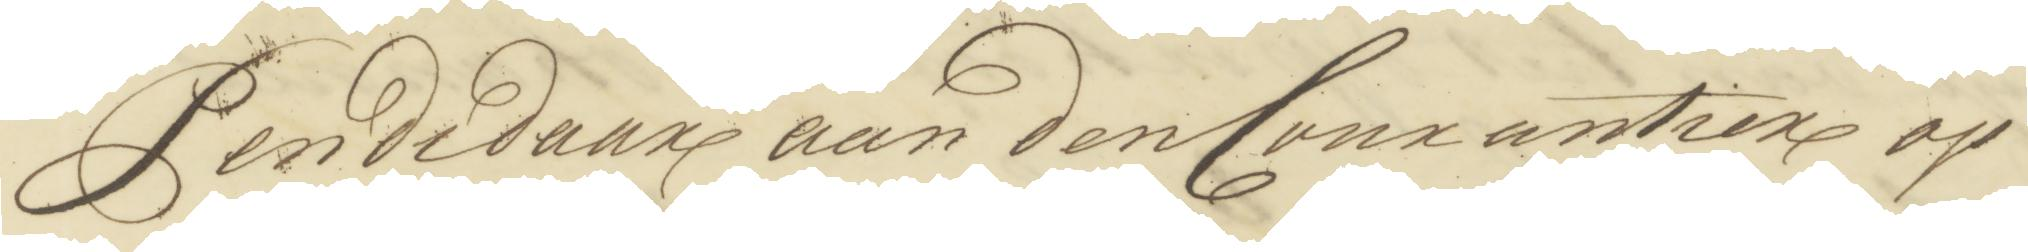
Pendidaar aan den Conrantier op
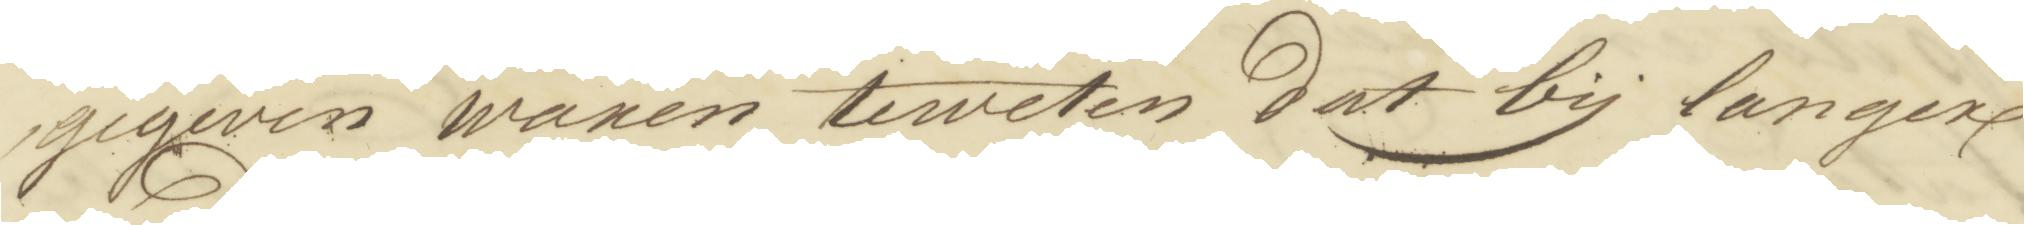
gegeven waren teweten dat bij langer
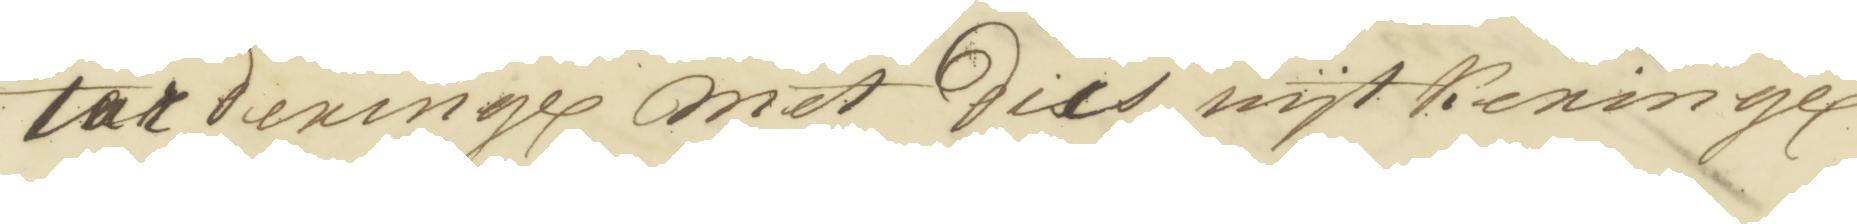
ter deringe met dies uijt koninge
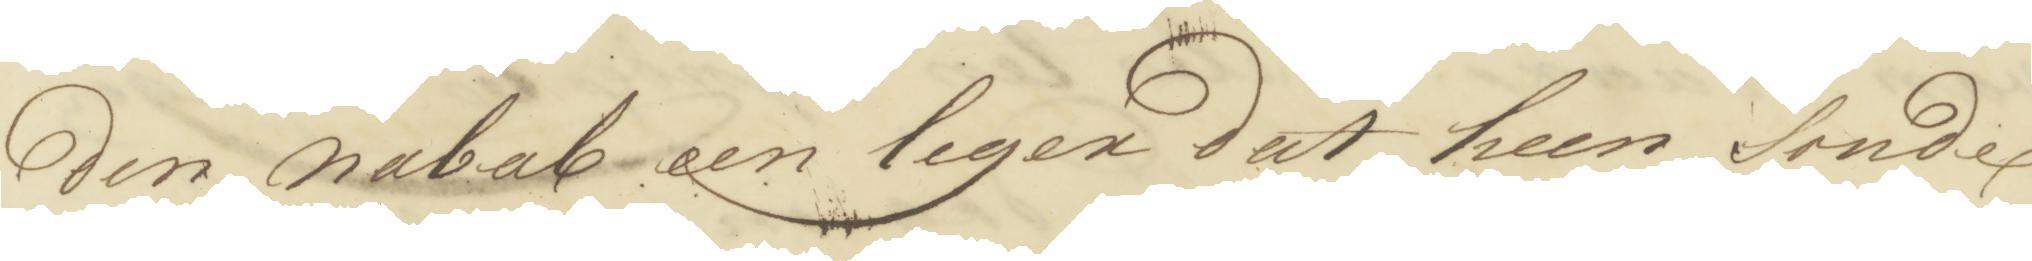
den nabab een leger dat heen soude
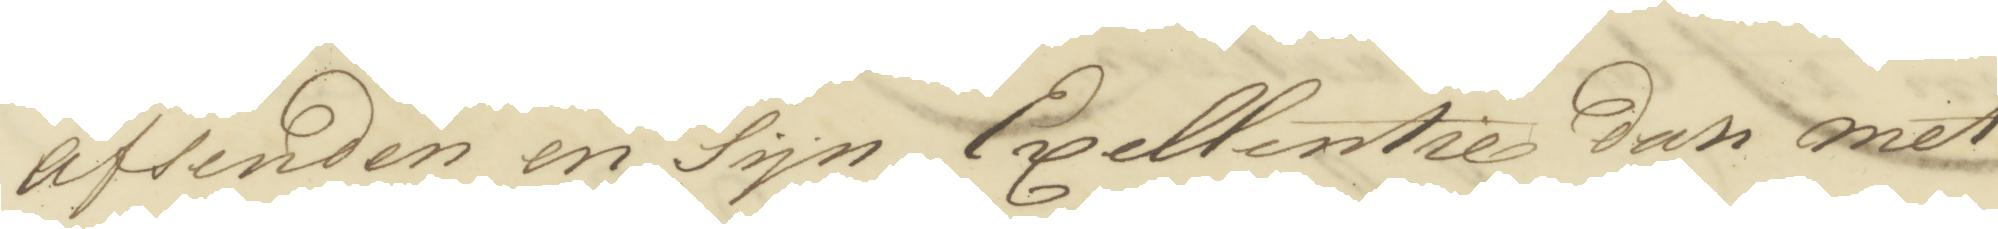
afsenden en sijn Exellentie dan met
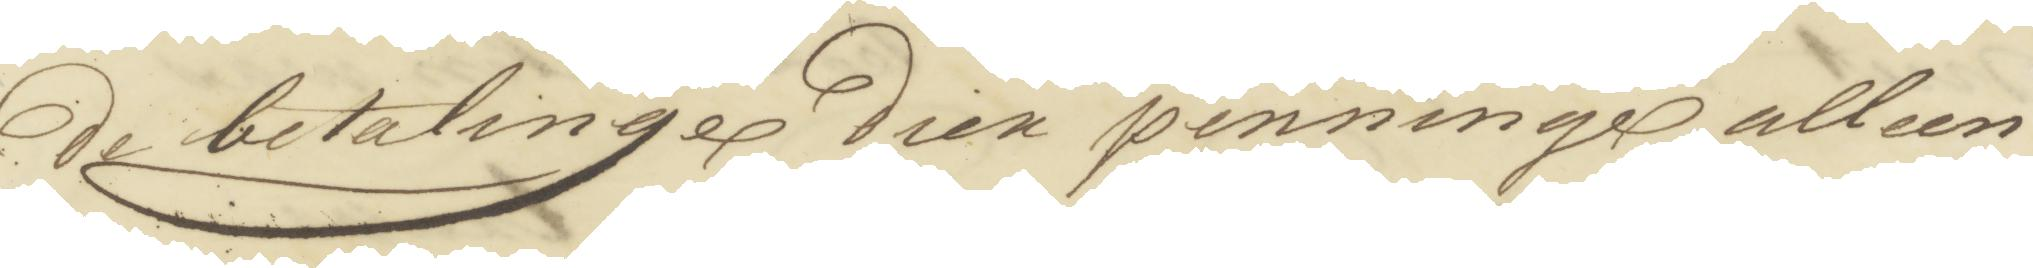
de betalinge dier penninge alleen
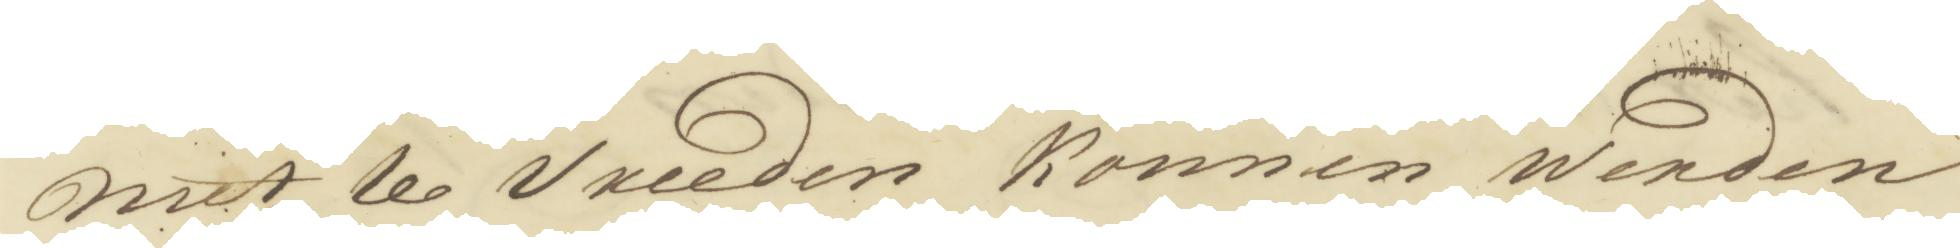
niet te vreeden konnen werden
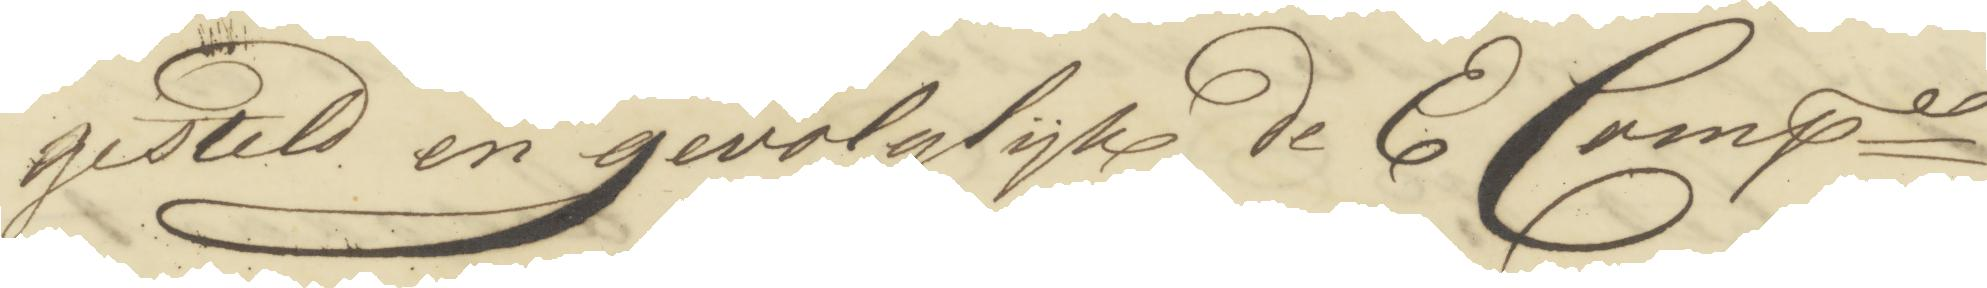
gesteld en gevolglijk de E Comp=e
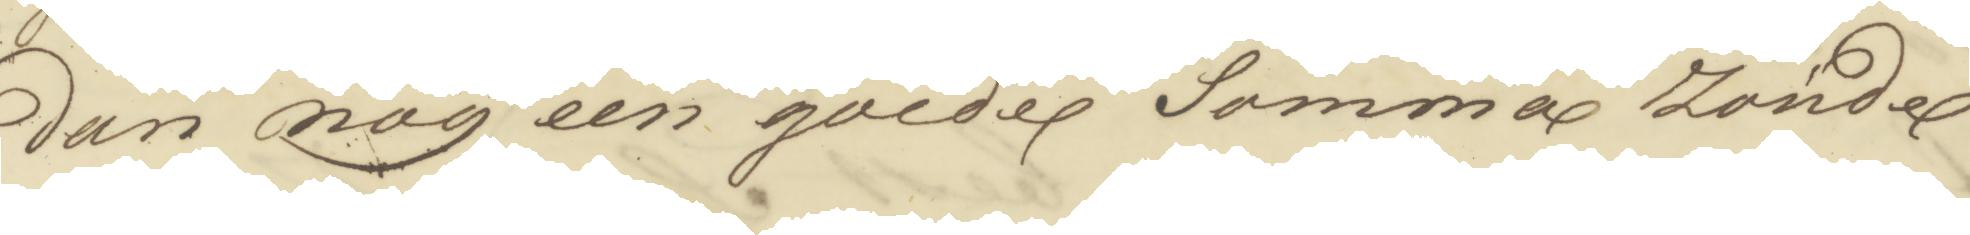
dan nog een goede somma zoude
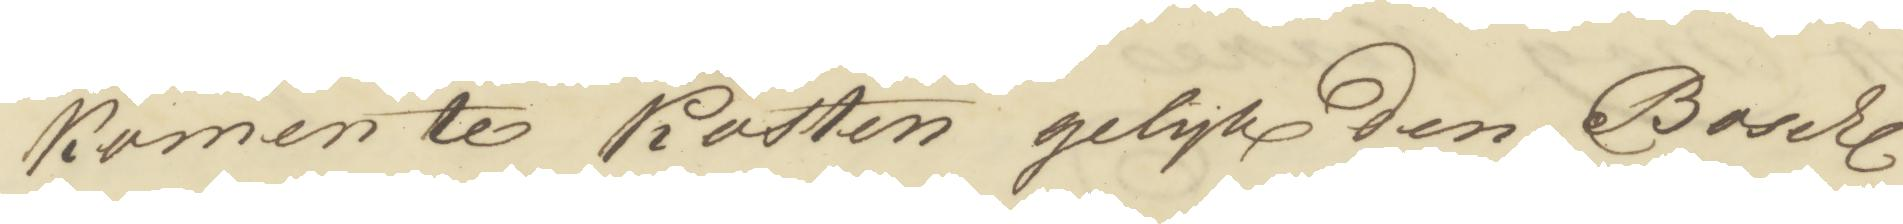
komen te kosten gelijk den Bosche
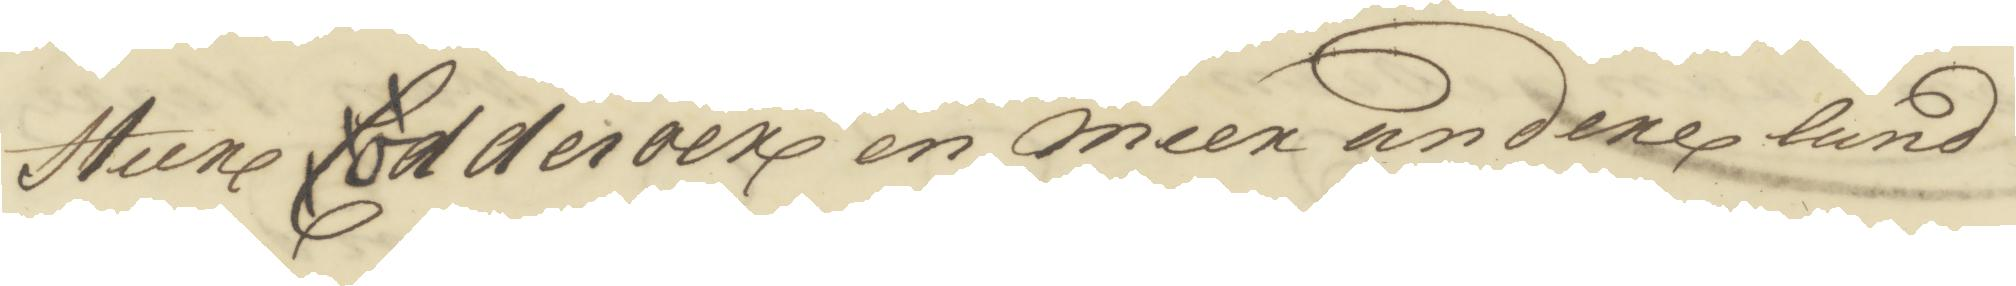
Heer Codderoer en meer andere land
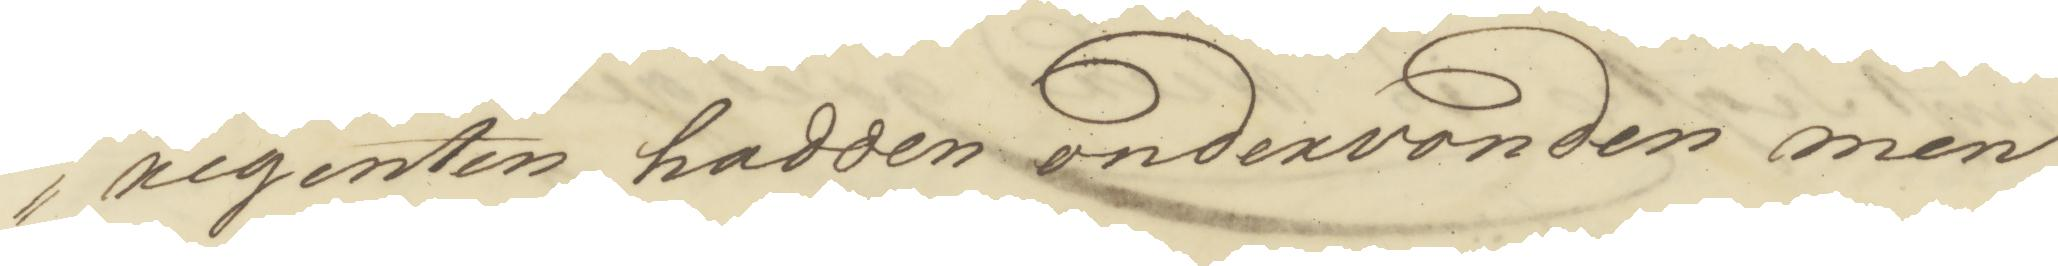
„regenten hadden ondervonden men
